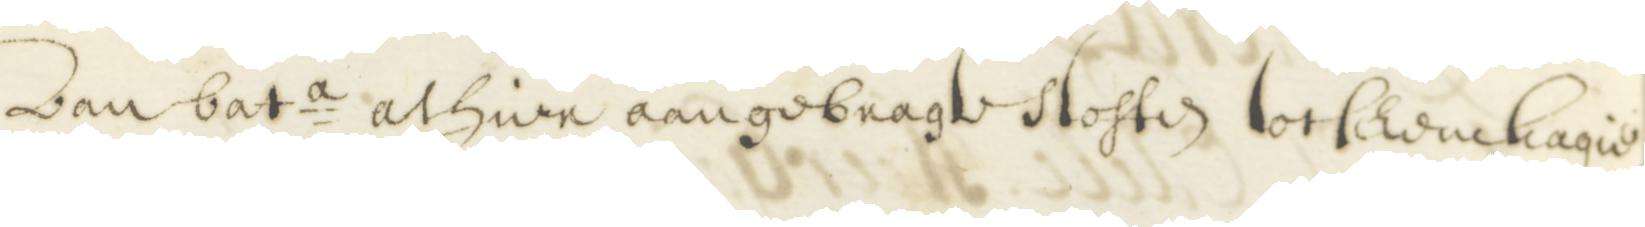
Van bat=a alhier aangebragte stoften tot schenckagie
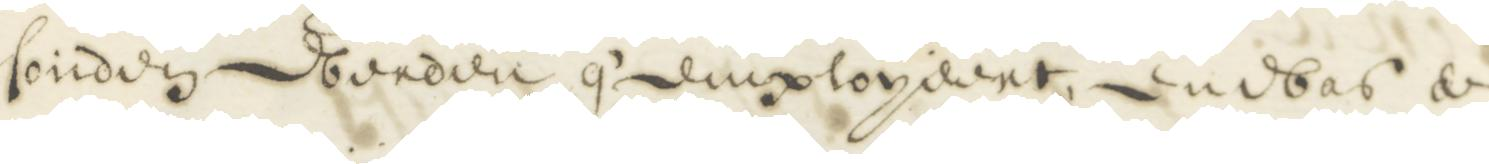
souden werden g’emploijeert, en was de
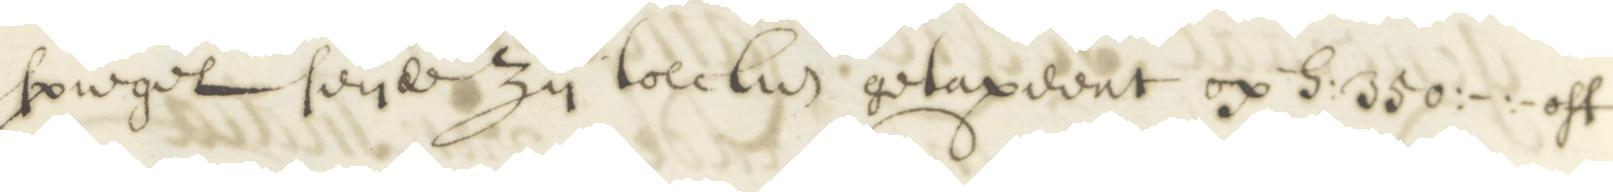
spiegel seijde zij tolcken getaxeert op h: 350:-:- off
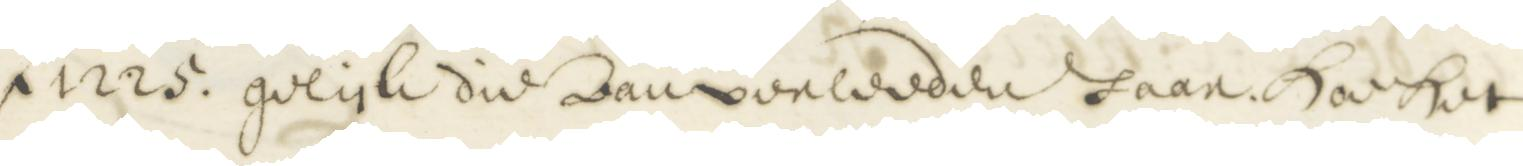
ƒ 1225. gelijk die van verleeden jaar hoe het
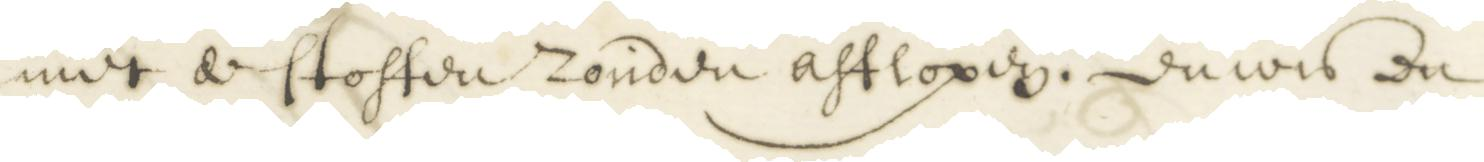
met de stoffen zouden afflopen. En wisten
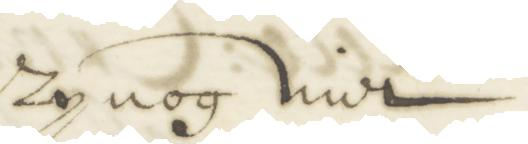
zij nog niet.
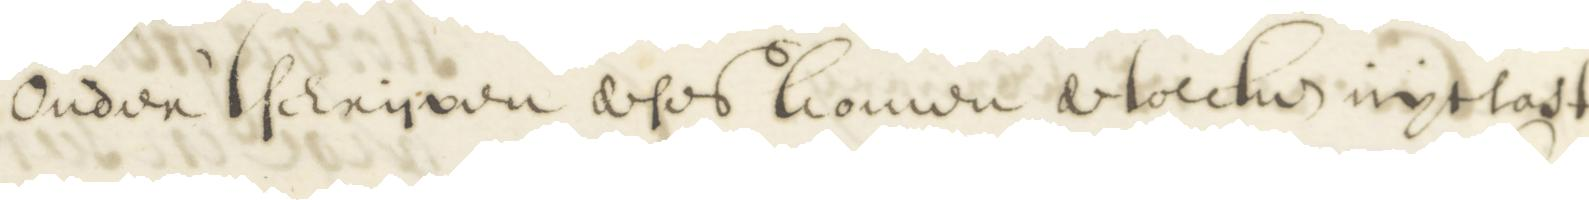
Onder ’t schrijven deses komen de tolcken uijtlast
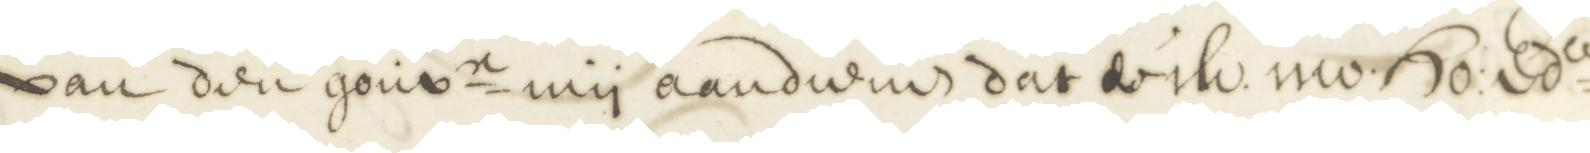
van den gouv=r mij aandienen dat de ik. uw. Ho: Ed=e
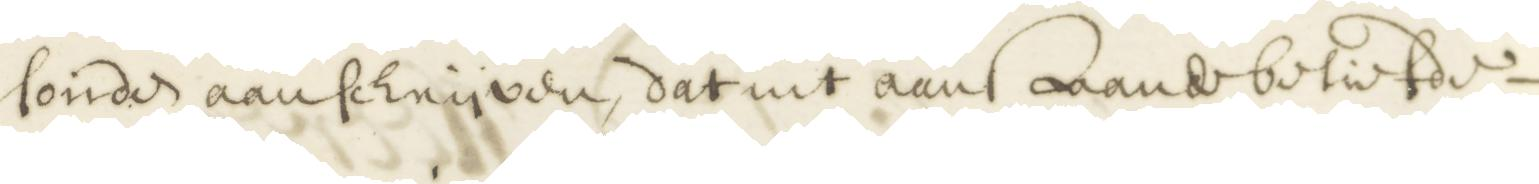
souden aanschrijven, dat in't aanstaande beliefde
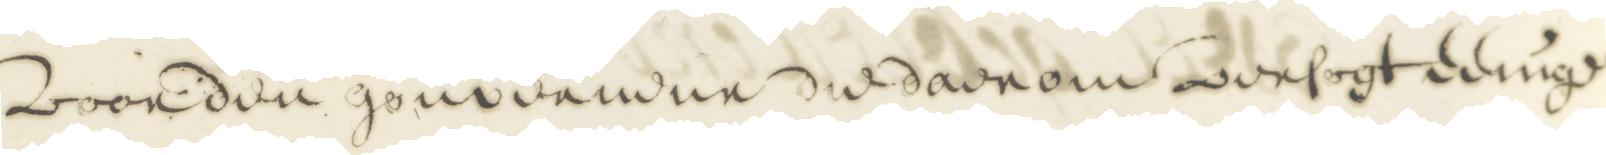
voor den gouverneur die daerom versogt eenige
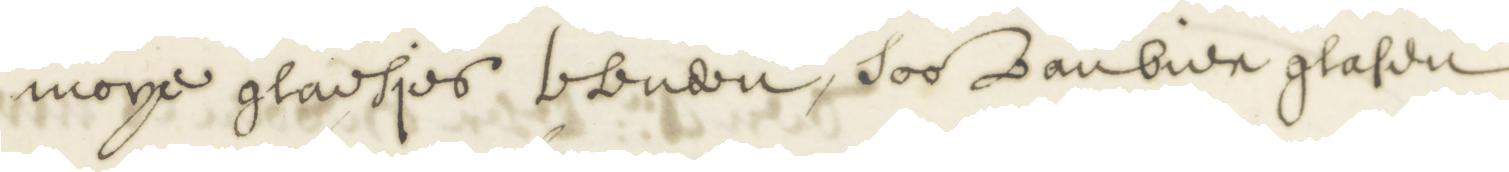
moije glaesjes te senden, soo vanbier glasen
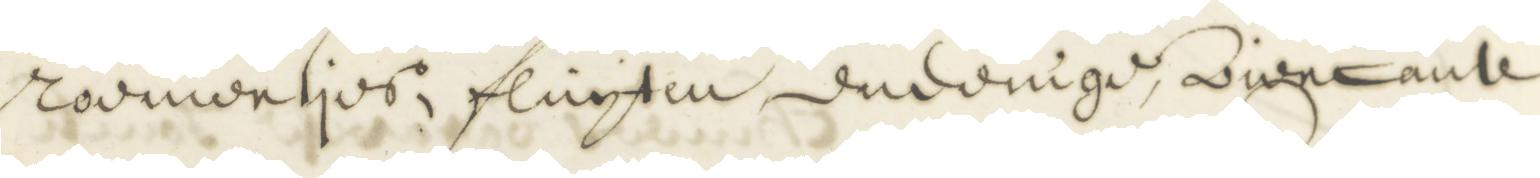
roemertjes, fluijten en eenige, viercante
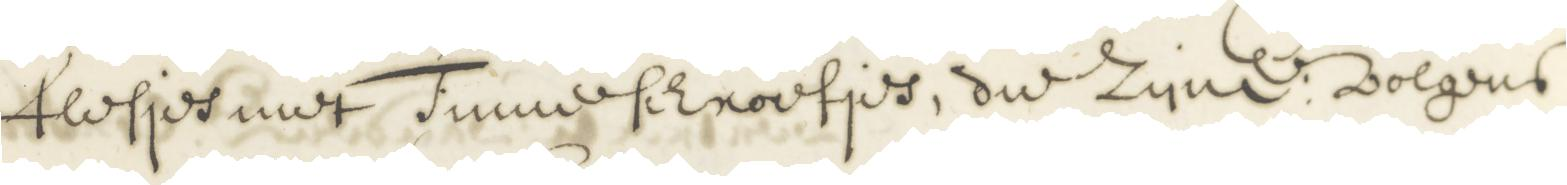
flesjes met Tinne schroefjes, die zijnE: volgens
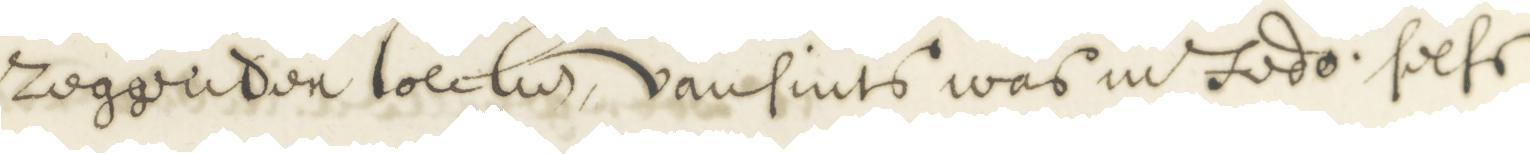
zeggen der tolcken, vansints was in jedo. selfs
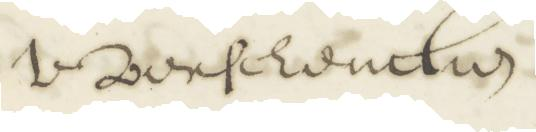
te verschencken
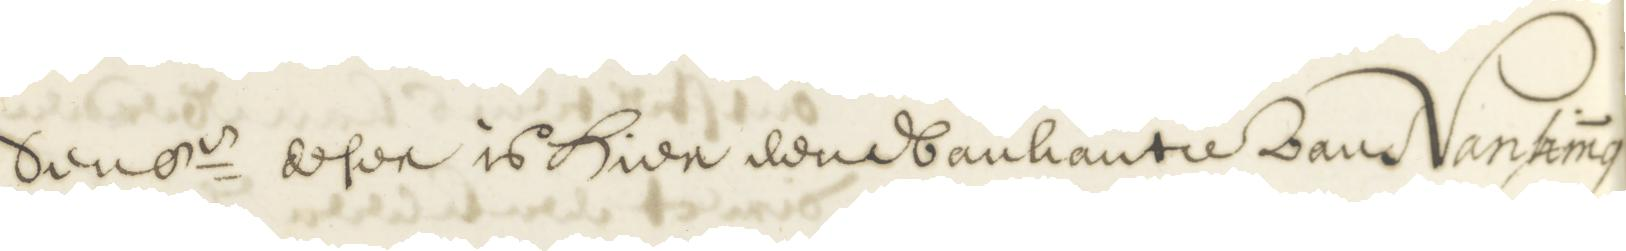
den 8=en deser is hier een wankantie van Nanking
